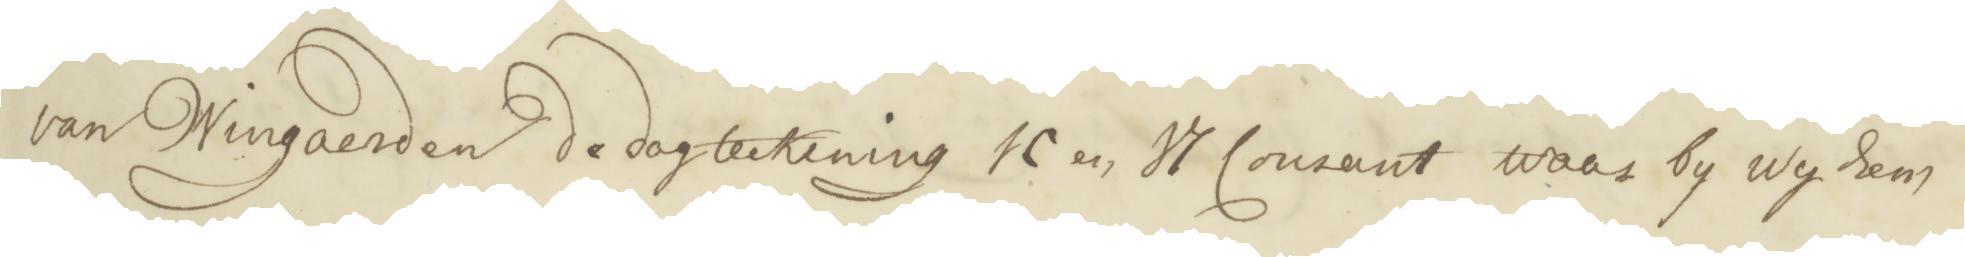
van Wingaerden de dagteekening 15 en 17 Courant waar by wy hem
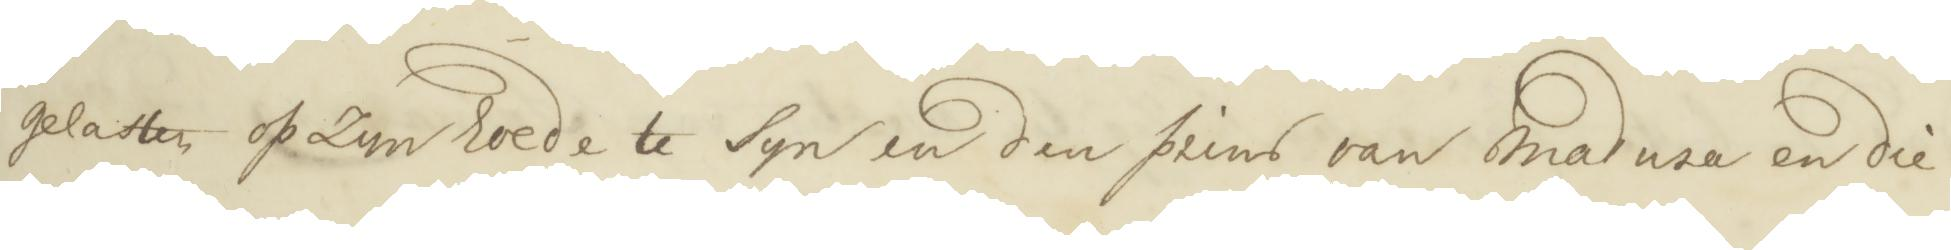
gelasten op zyn hoede te syn en den prins van madura en die
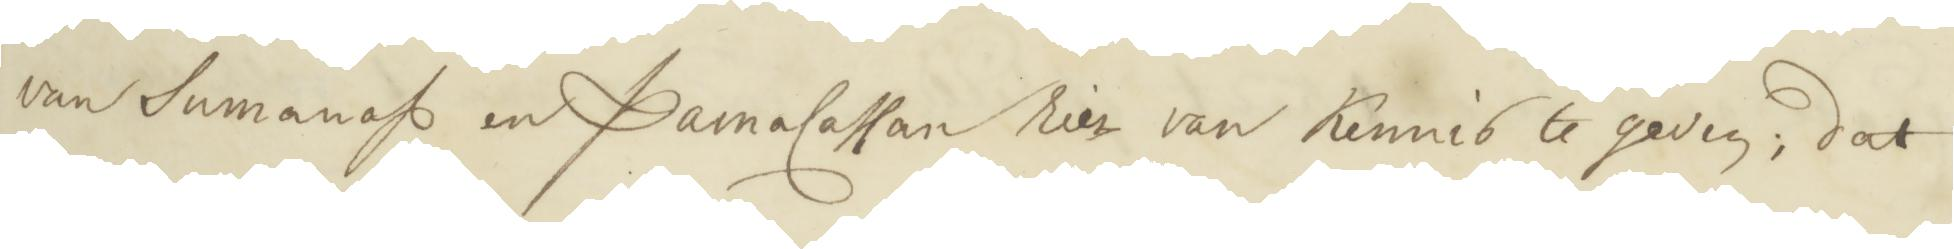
van Sumanap en Pamacassan hier van kennis te geven; dat
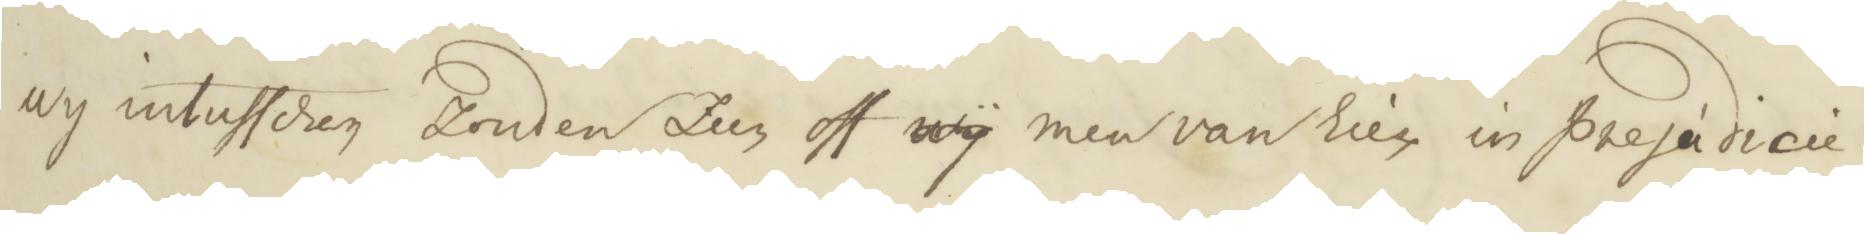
wy intusschen zouden zien off wij men van hier in prejudicie
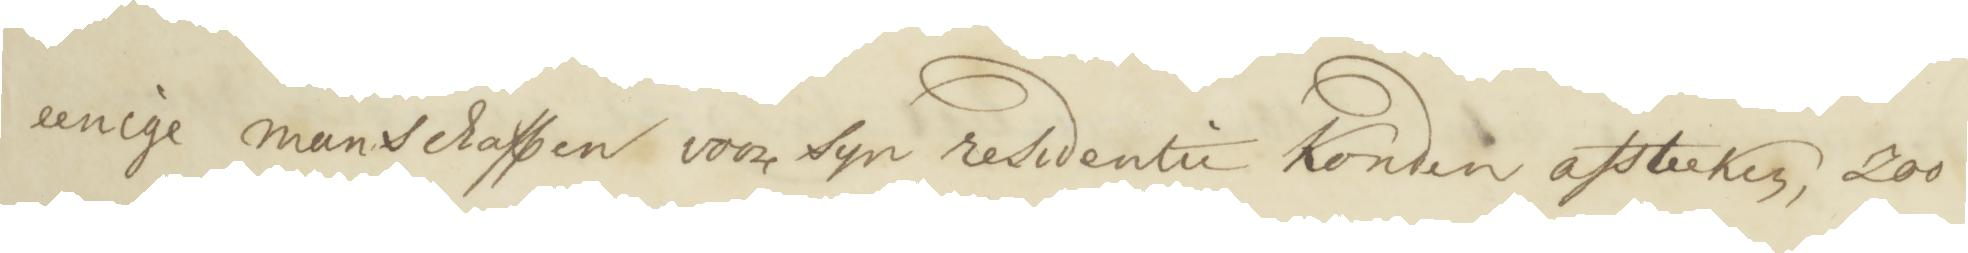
eenige manschappen voor syn residentie konden afsteeken, zoo
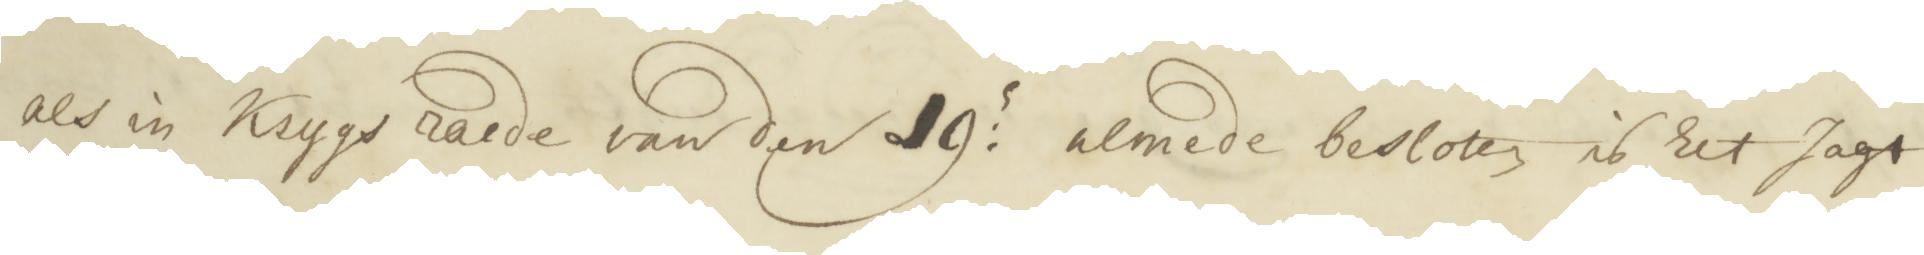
als in krygs raede van den 19:' almede besloten is het Jagt
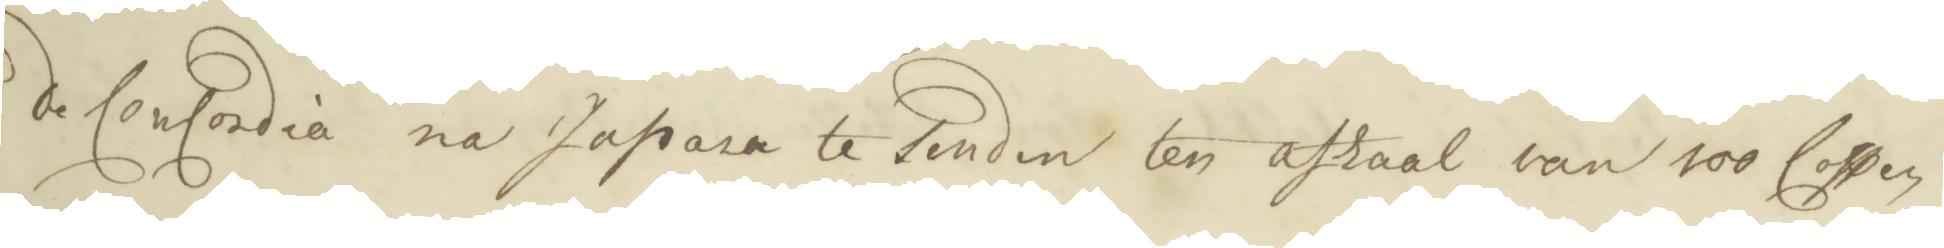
de Concordia na Japara te senden ten afhaal van 100 Coppen
